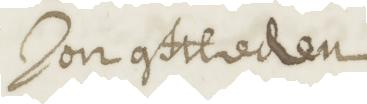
Jongstleden
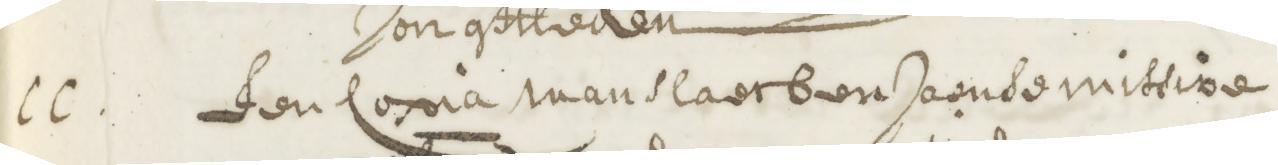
C C: Een Copia manslaet ben Joanse missive
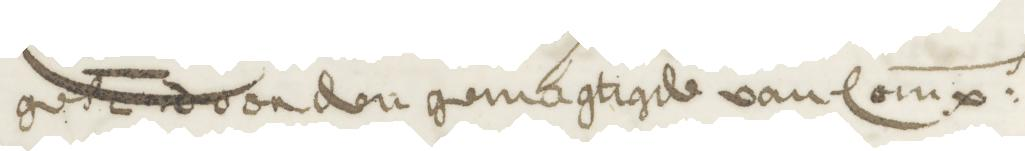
gest door den gemagtigde van Comp:s
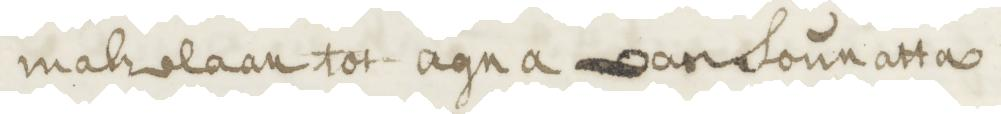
makelaar tot agra van souratta
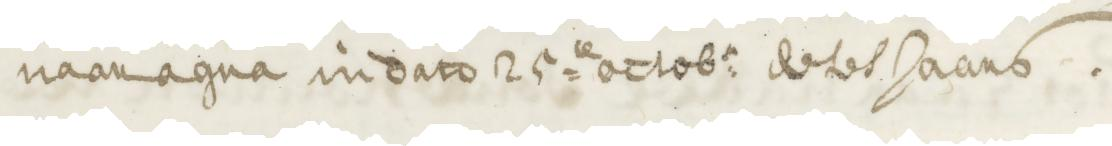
naar agra in dato 25=e octob:r deses Jaars.
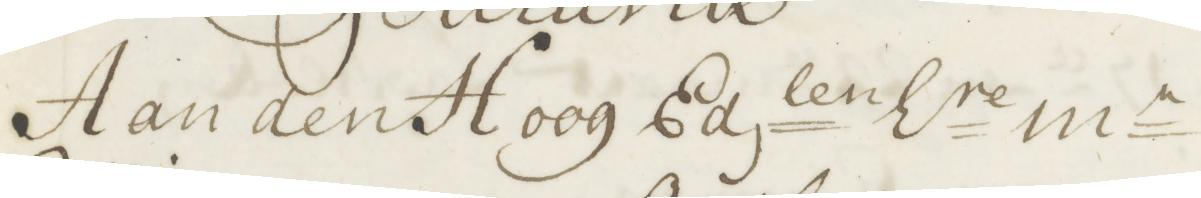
Aan den Hoog Ed=len h=re m=r
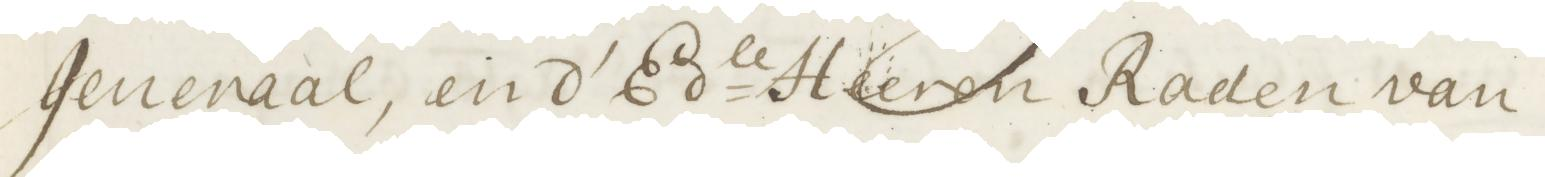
generaal, en d’Ed=le Heeren Raden van
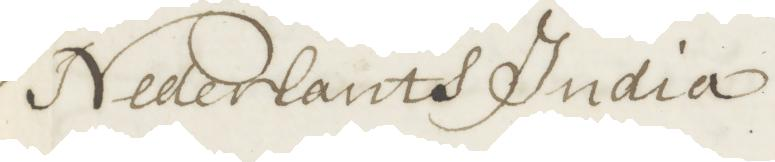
Nederlants India
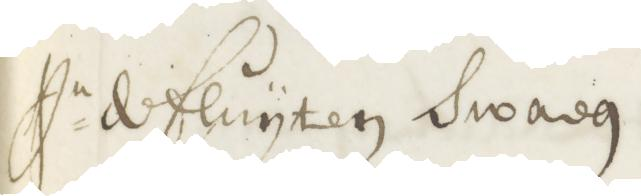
P=r de fluijten swaeg
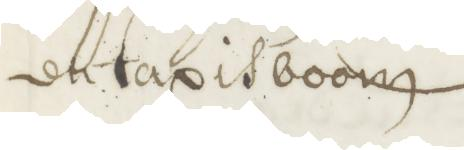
en taxisboom
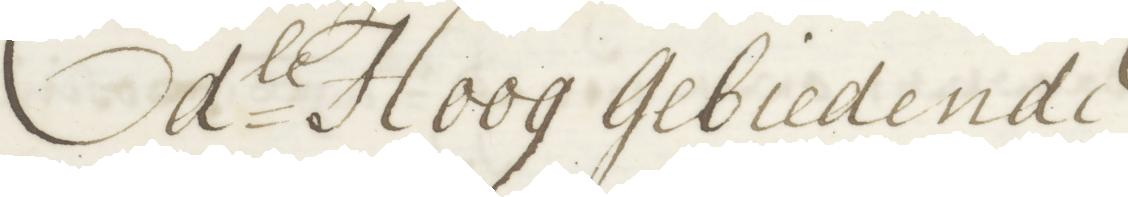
Ed=le Hoog gebiedende
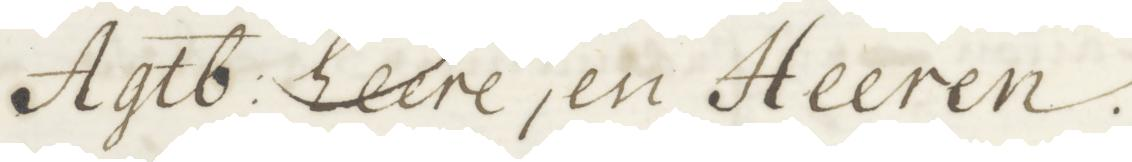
Agtb: heere, en Heeren.
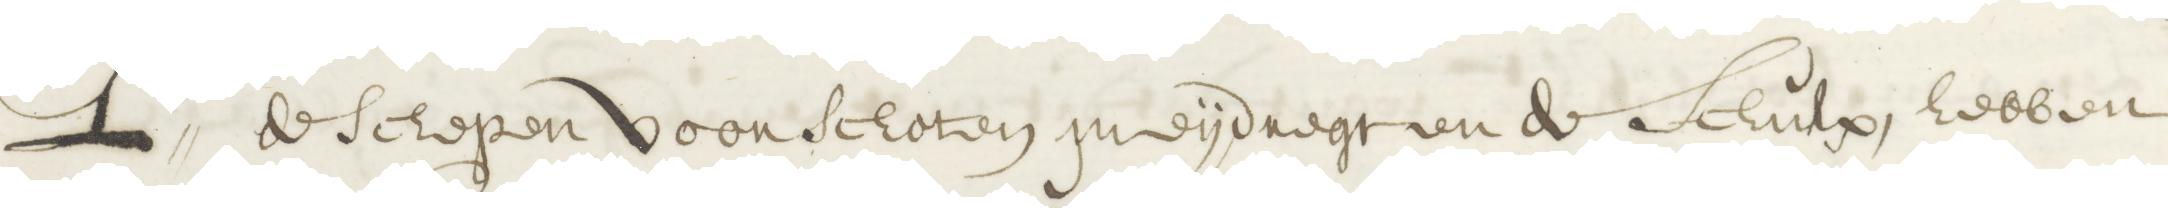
P„r de schepen voorschoten in meijdregt en de schulp, hebben
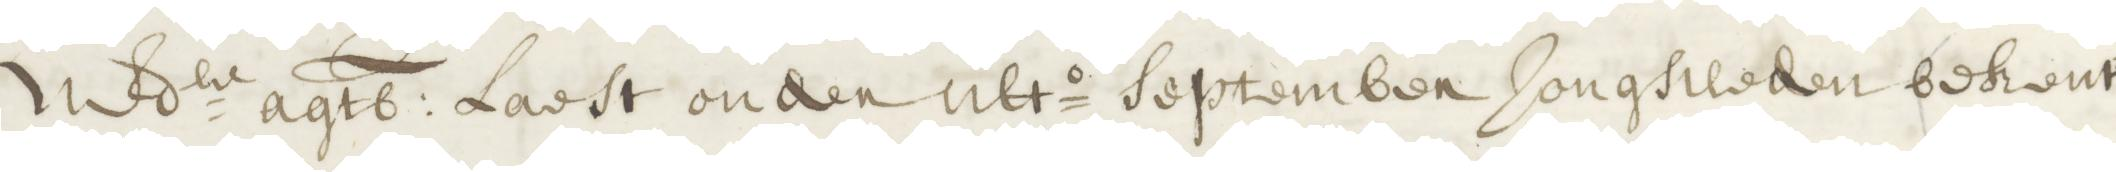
UEd=le agtb: Laest onder ult=o september Jongstleden bekent
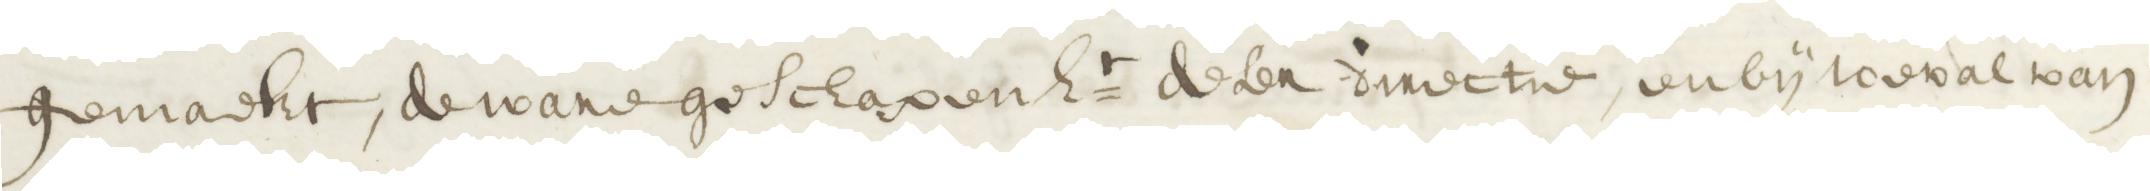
gemaekt, de ware geschapen h=t deser directie, en bij toeval van
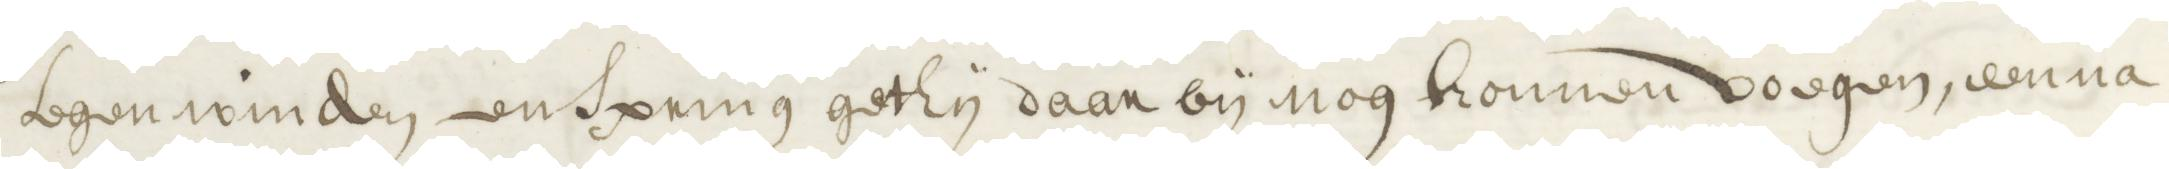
tegen winden en spring gethij daar bij nog konnen voegen, een na
